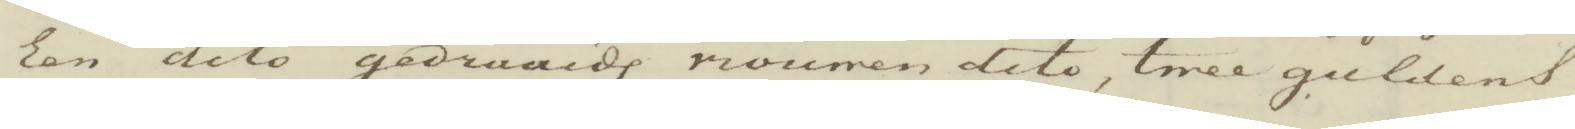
Een dito gedraaide vrouwen dito, twee guldens
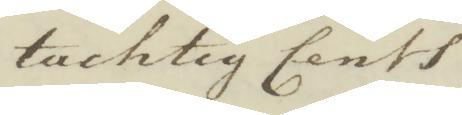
tachtig Cents
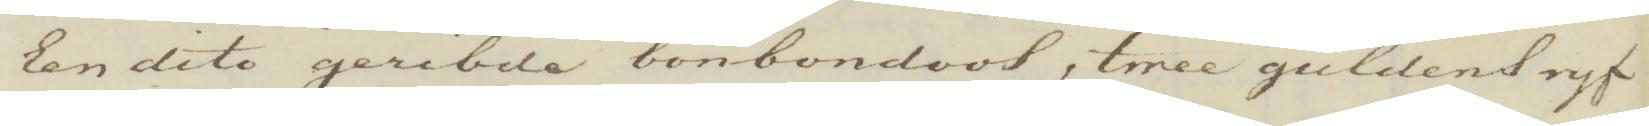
Een dito geribde bonbondoos, twee guldens vyf
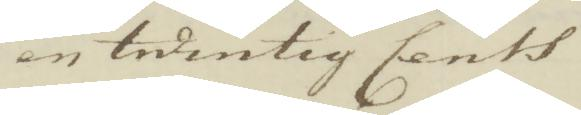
en twintig Cents
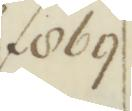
ƒ869
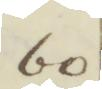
,, - 60
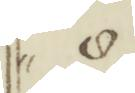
„ 8
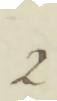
,, 2
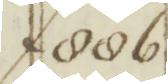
ƒ 886
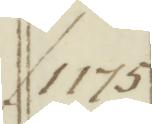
ƒ 1175
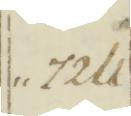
„ 724
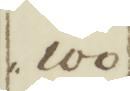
„ 100
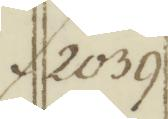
ƒ2039
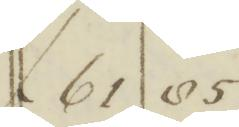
ƒ 61 85
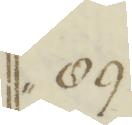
„ 89
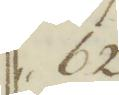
„ 62
